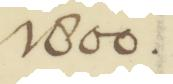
1800.
